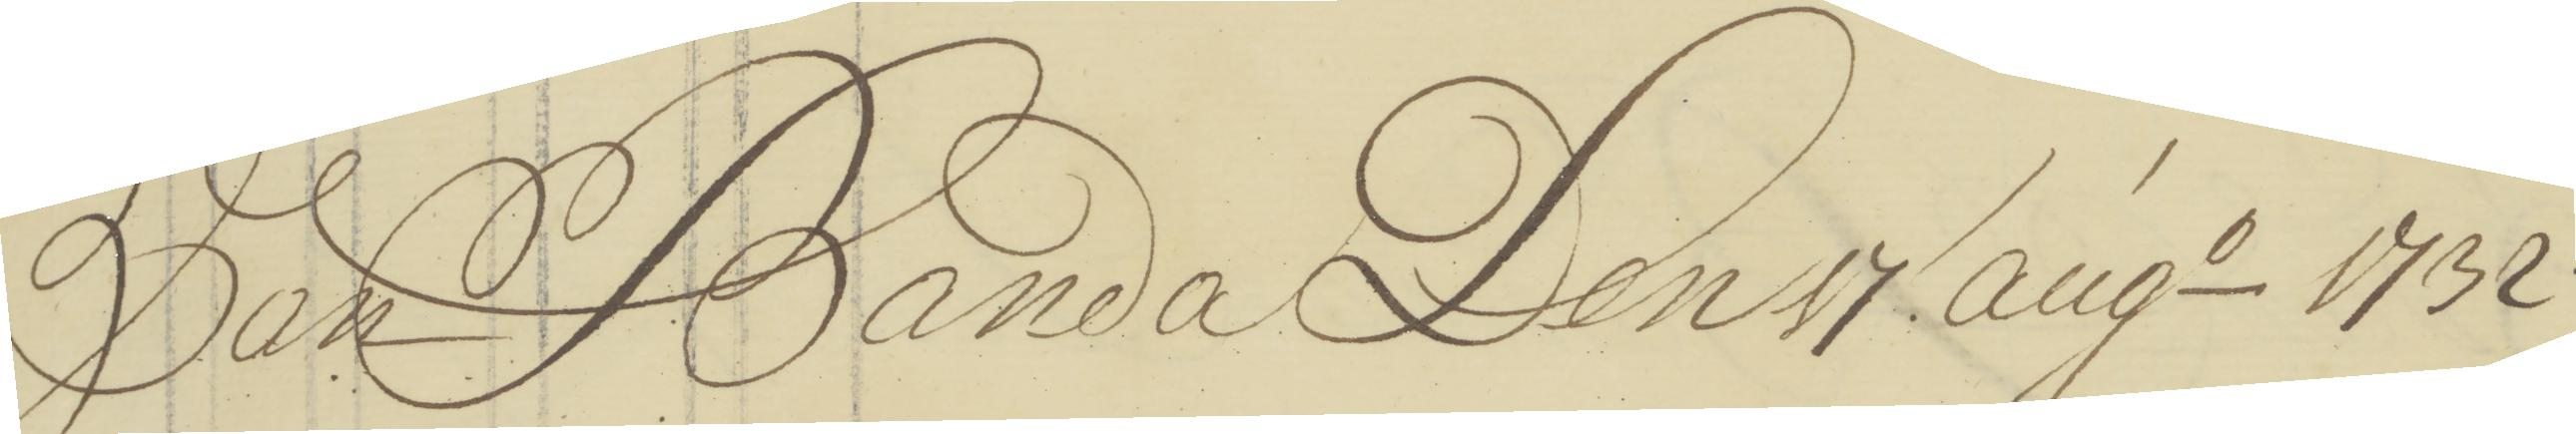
Van Banda Den 17.' aug=o 1732
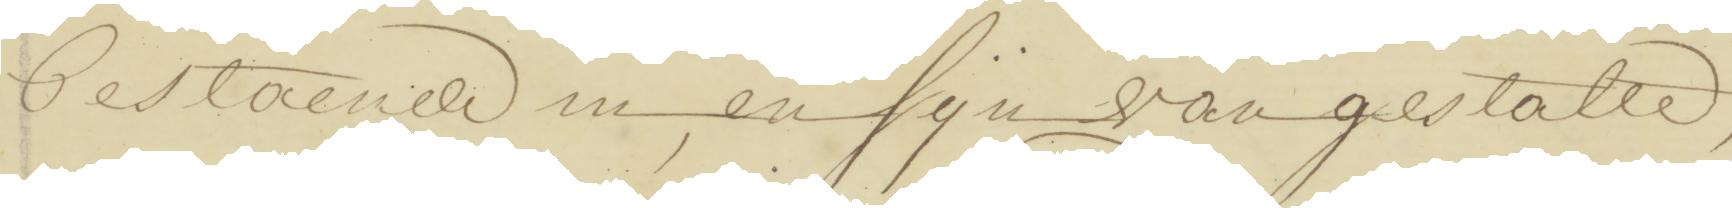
bestaende in, en sijn van gestalte,
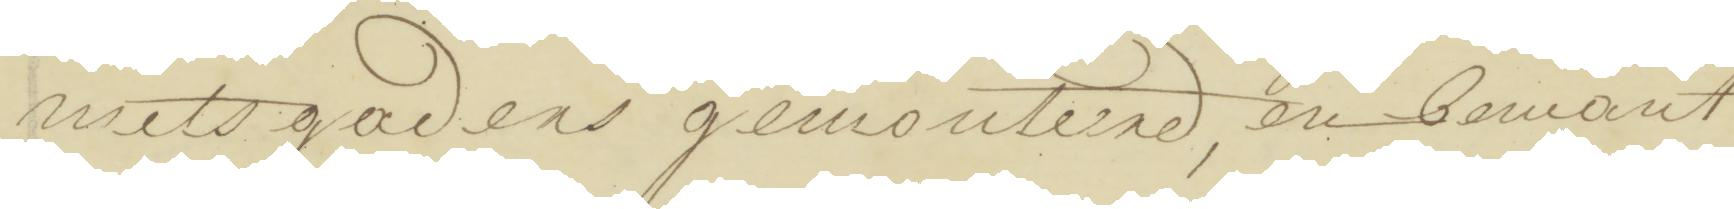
mitsgaders gemonteerd, en bemant
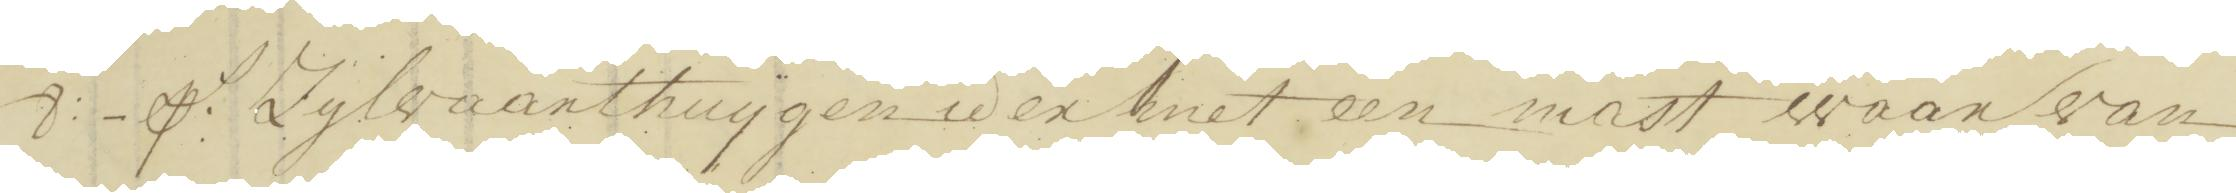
8: – p:s Zijlvaarthuijgen ider met een mast, waar van
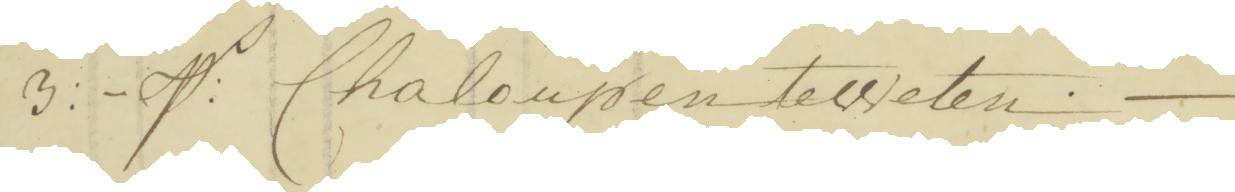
3: – p:s Chaloupen te weten. —
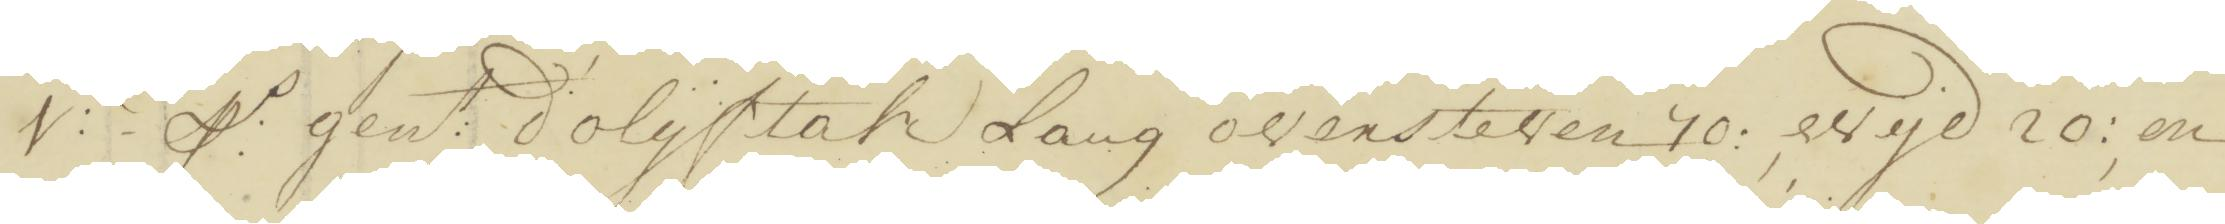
1: - p:s gen:t d'olijftak Lang oversteven 70:, wijd 20:, en
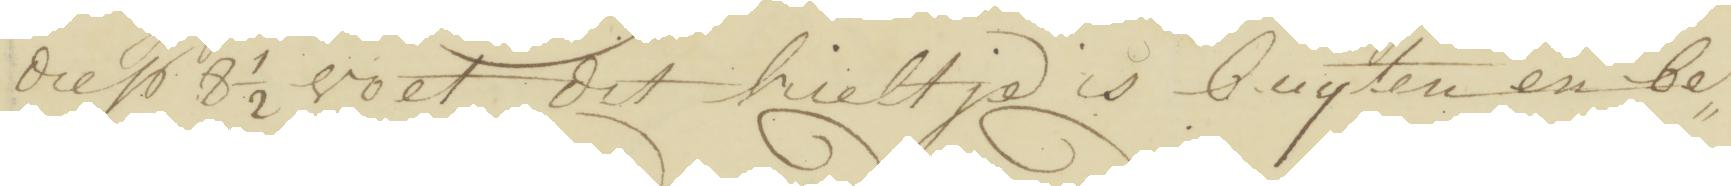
die p 8½ voet, dit kieltje is buijten en be„
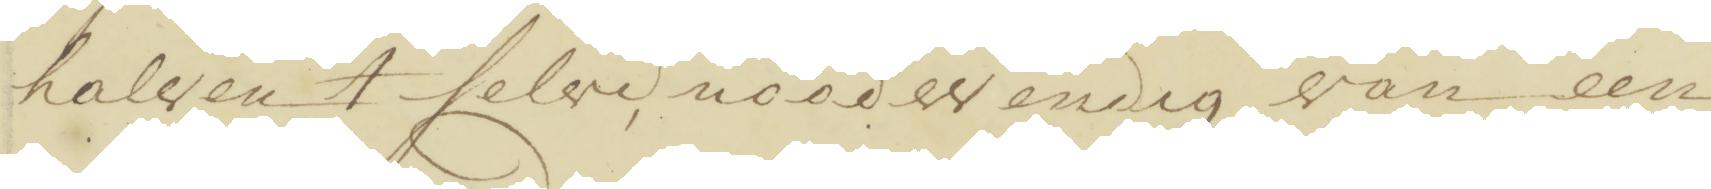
halven 't selve, noodwendig van een
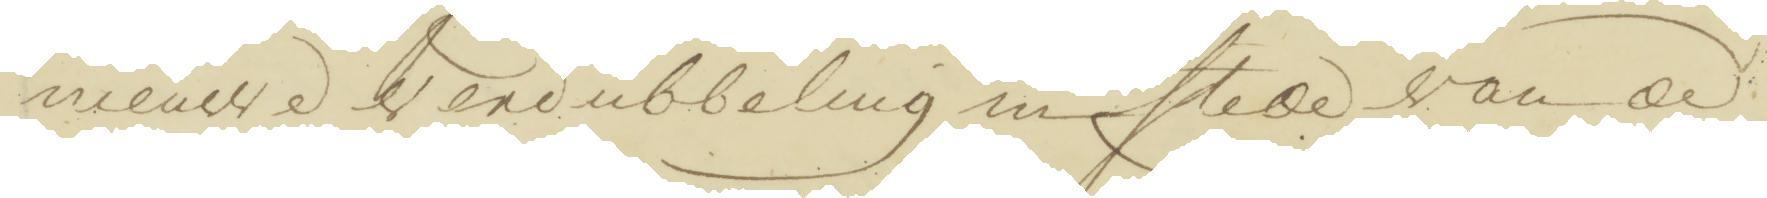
nieuwe verdubbeling in Stede van de
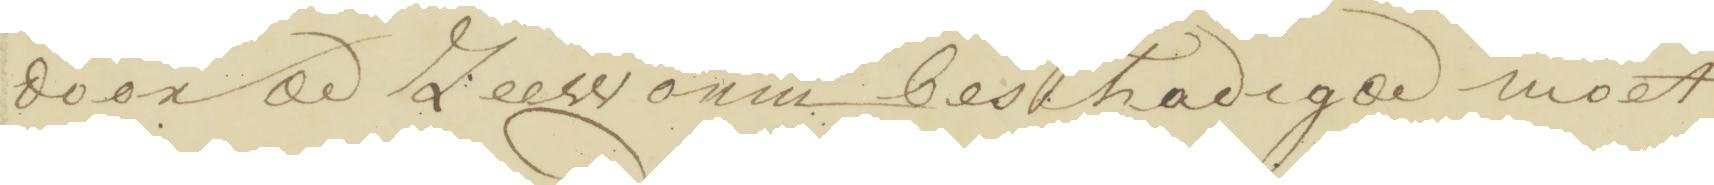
door de Zeeworm beschadigde moet
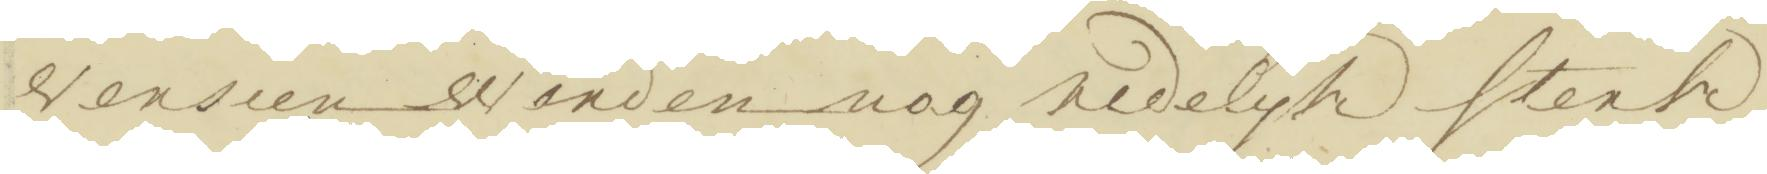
versien worden nog redelijk Sterk,
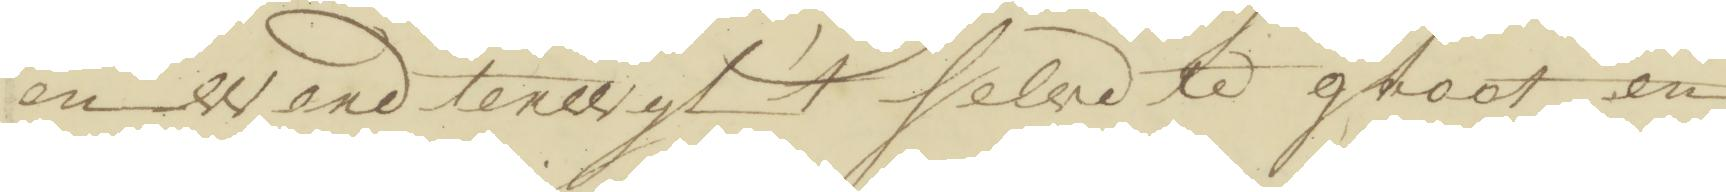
en werd terwyl ’t Selve te groot en
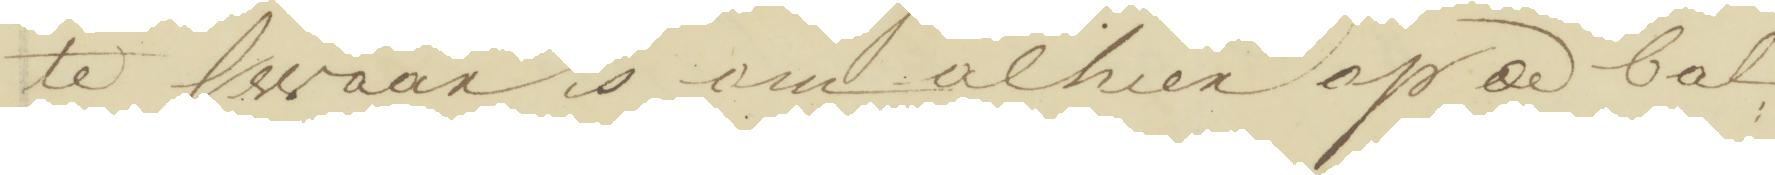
te Swaar is, om alhier op de bal„
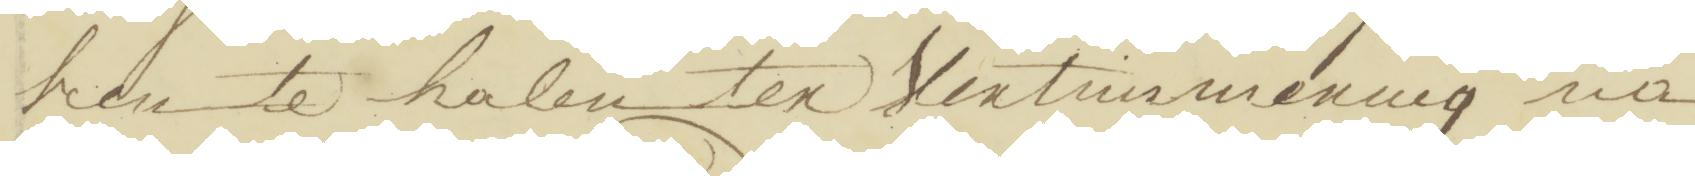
ken te halen ter Vertimmering na
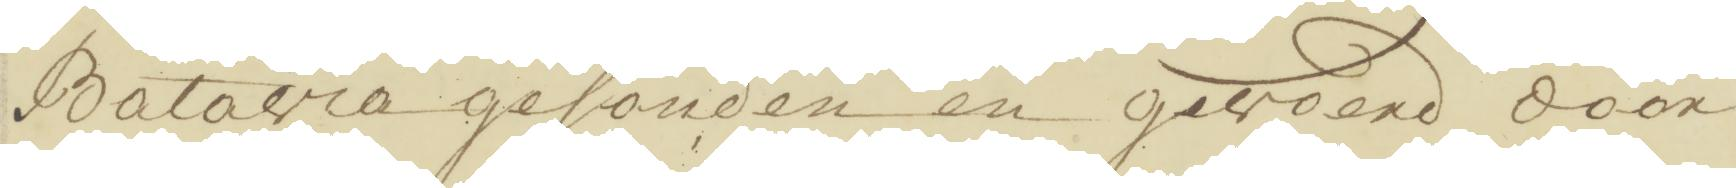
Batavia gesonden, en gevoerd door
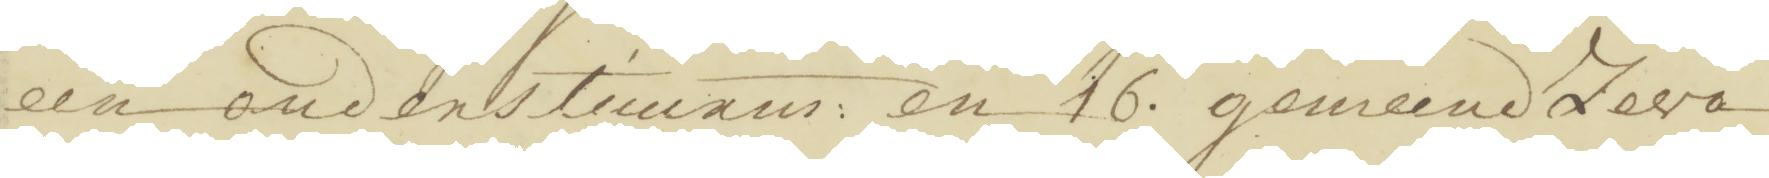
een onderstuurm: en 16. gemeene Zeva
